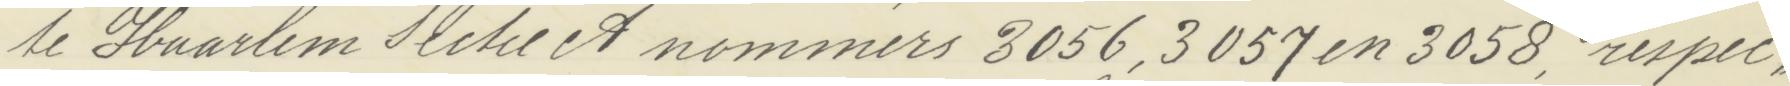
te Haarlem Secte A nommers 3056, 3057 en 3058, respec„
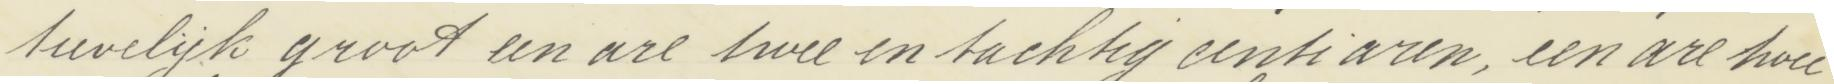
tievelijk groot een are twee en tachtig centiaren, een are twee
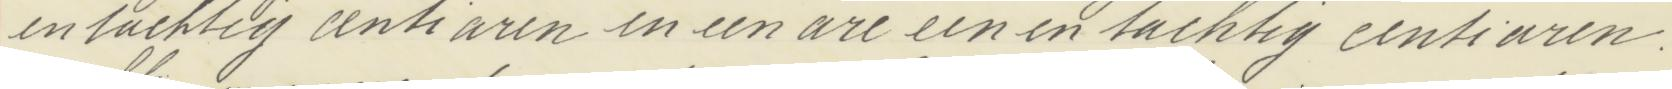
en tachtig centiaren en een are een en tachtig centiaren.
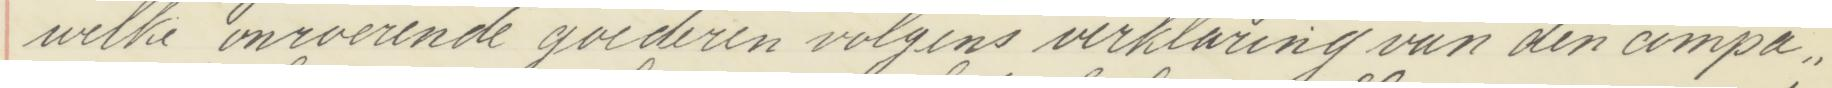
welke onroerende goederen volgens verklaring van den compa„
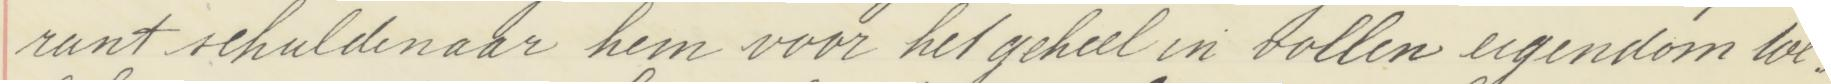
rant schuldenaar hem voor het geheel in vollen eigendom toe„
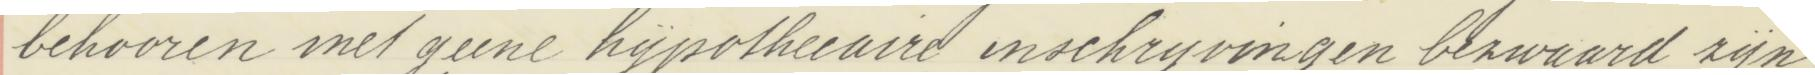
behooren met geene hijpothecaire inschryvingen bezwaard zijn
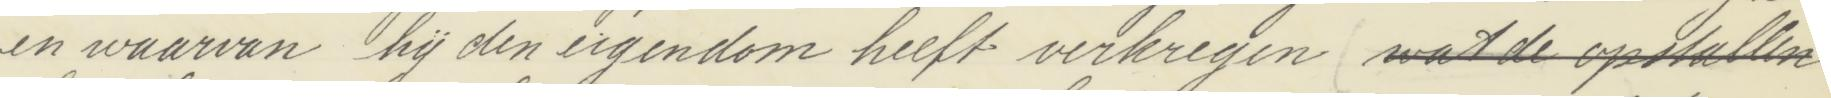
en waarvan hij den eigendom heeft verkregen ( wat de opstallen
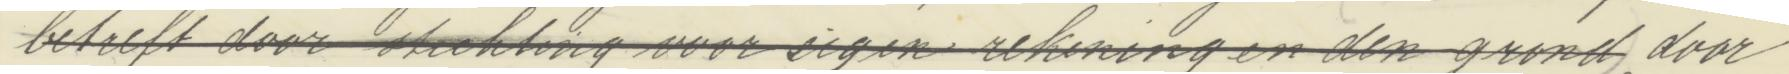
betreft door stichting voor eigen rekening en den grond) door
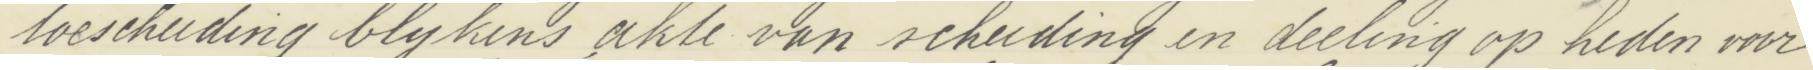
toescheiding blykens akte van scheiding en deeling op heden voor
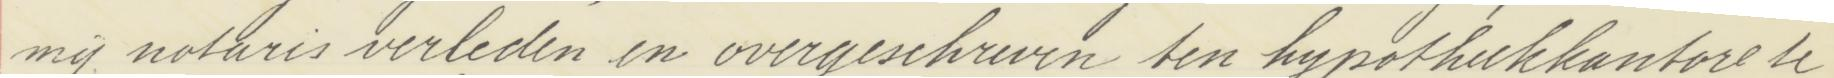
mij notaris verleden en overgeschreven ten hypotheekkantore te
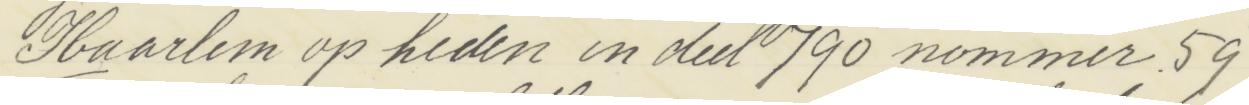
Haarlem op heden in deel 790 nommer 59
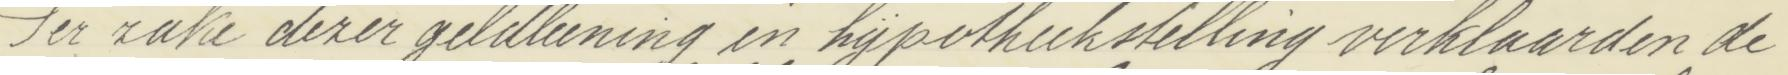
Ter zake dezer geldleening en hijpotheekstelling verklaarden de
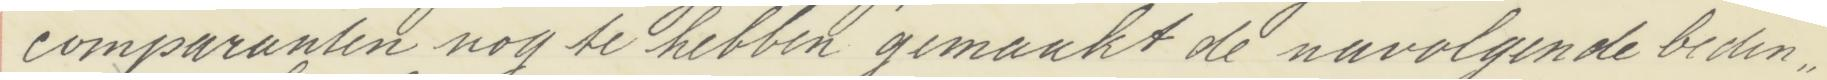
comparanten nog te hebben gemaakt de navolgende bedin„
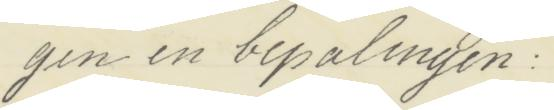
gen en bepalingen:
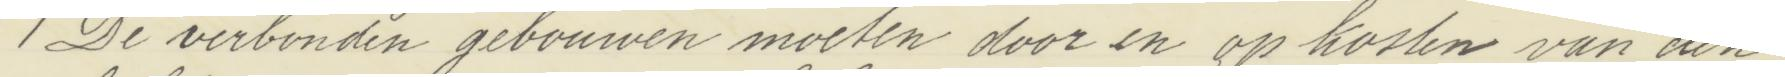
1 De verbonden gebouwen moeten door en op kosten van den
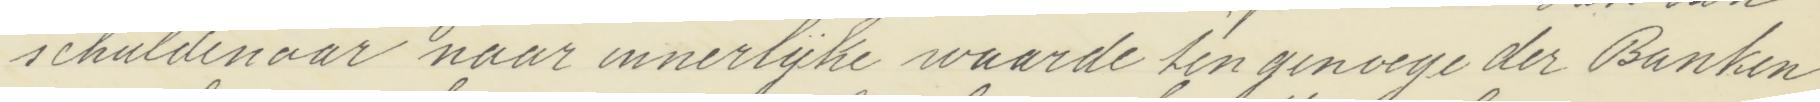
schuldenaar naar innerlijke waarde ten genoege der Banken
